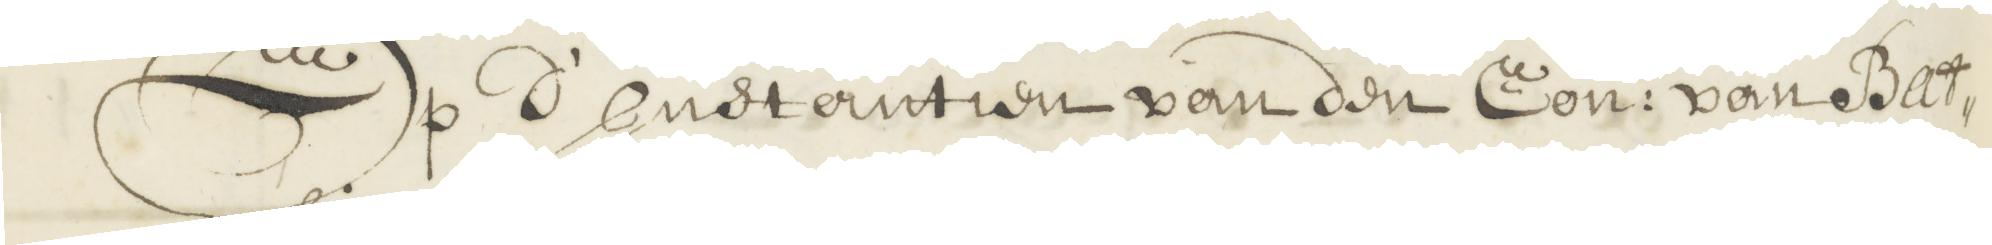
Op d’jnstantien van den Con: van Bat„
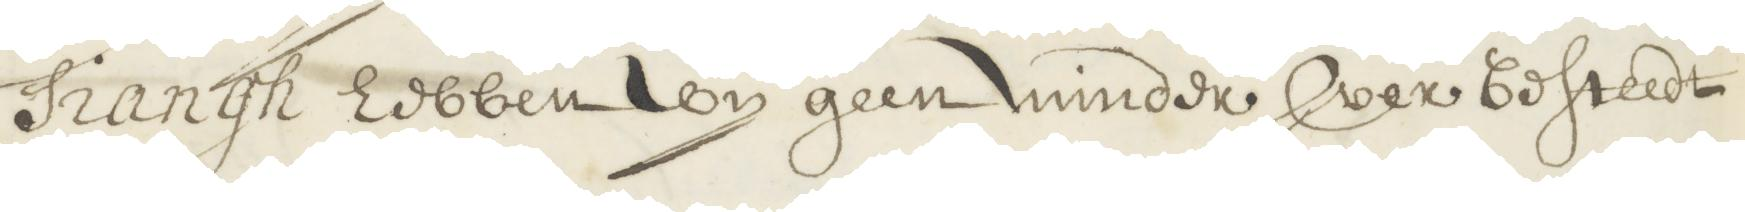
siangh hebben wy geen minder jver besteedt
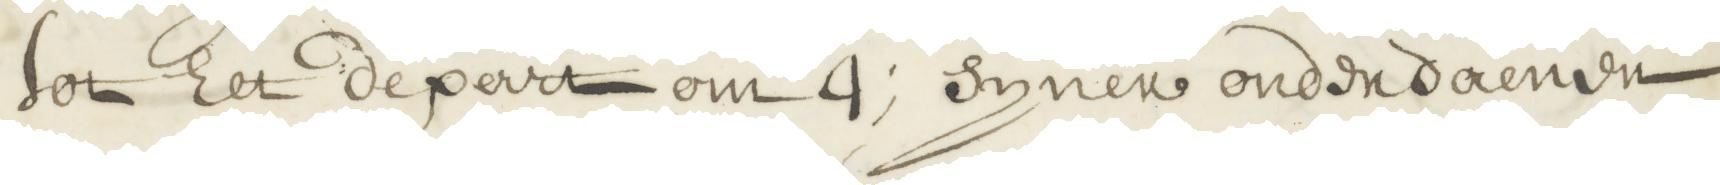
tot het depart om 4; syner onderdaenen
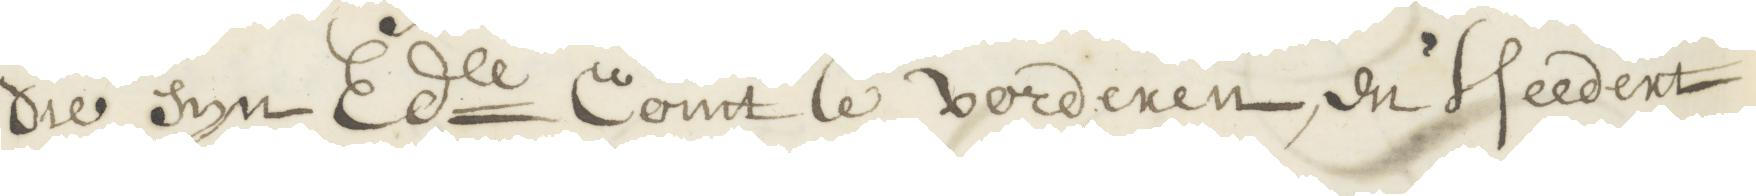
die syn Ed=le Comt te vorderen, en 'tseedert
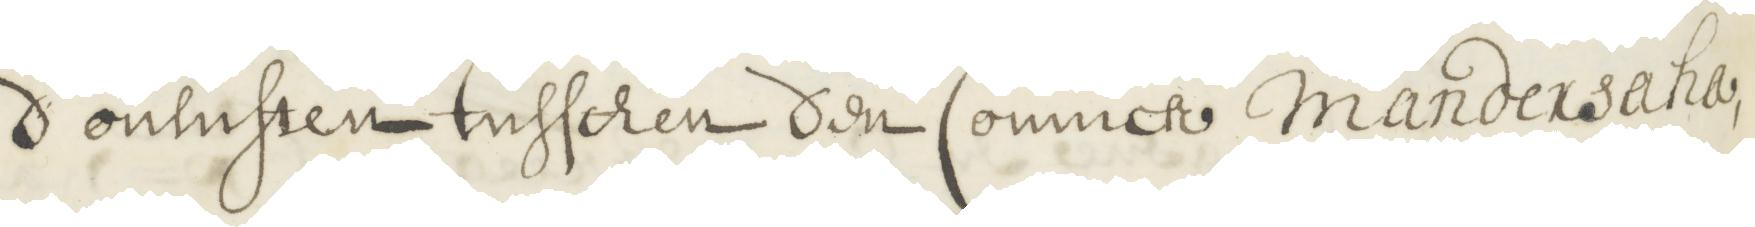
d’ onlusten tusschen den Coninck Mandersaha,
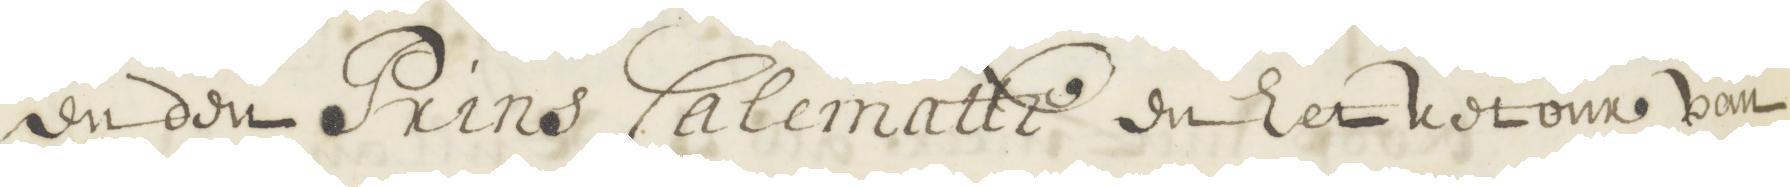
en den Prins Calematte en het retour van
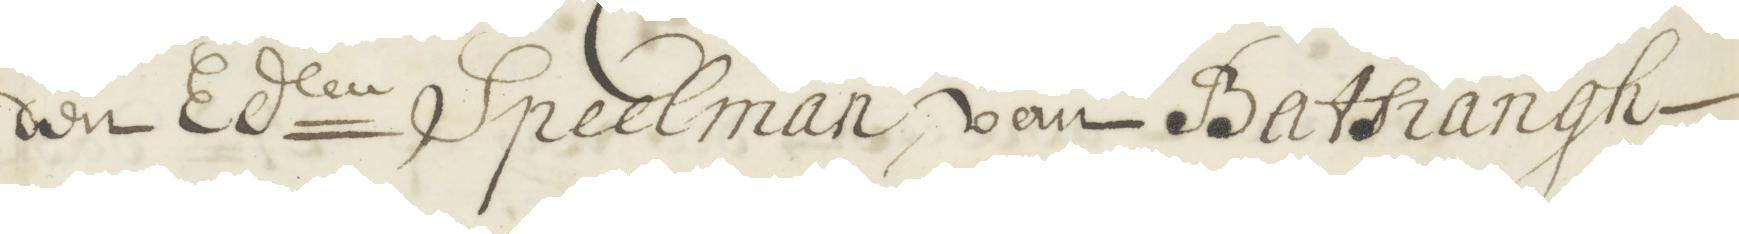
den Ed=len Speelman, van Batsiangh—
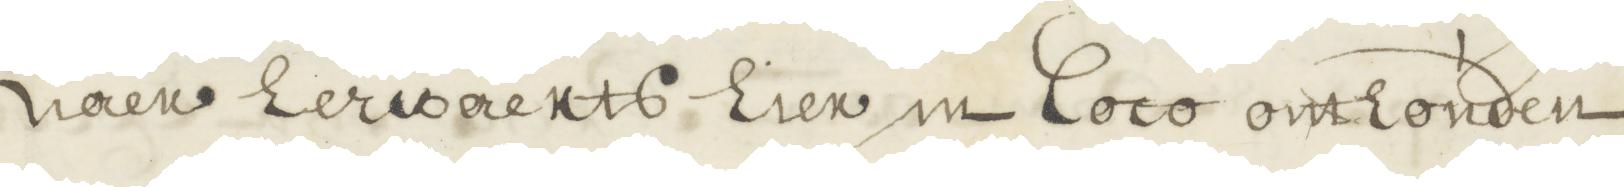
naer herwaerts hier in loco onthouden
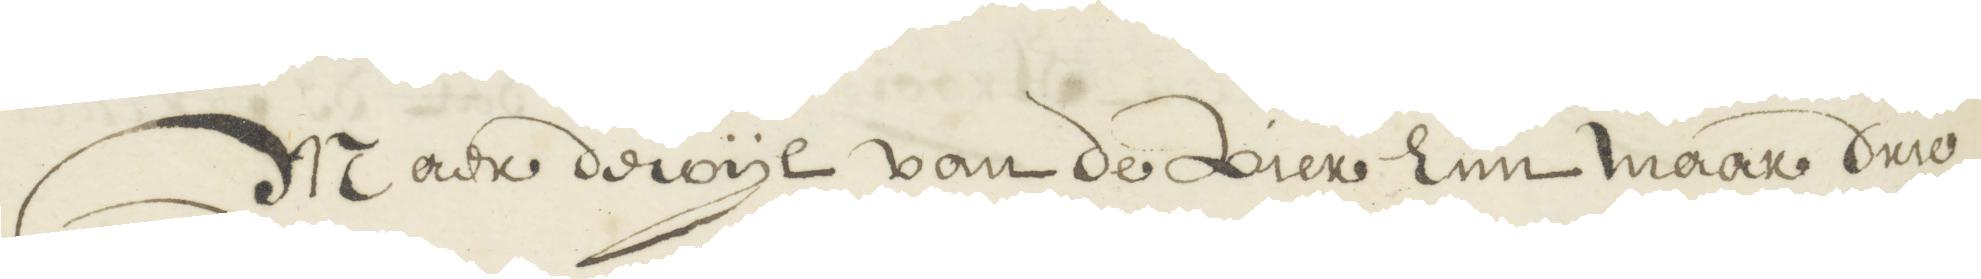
Maer dewijl van de vier hun maar drie
